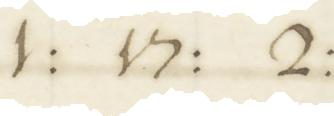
1: 17: 2:
